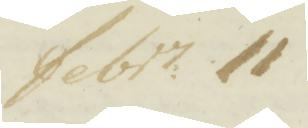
febr:y 11
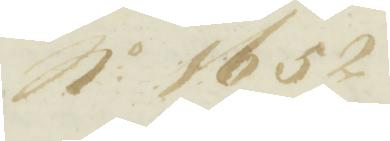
N:o 1652
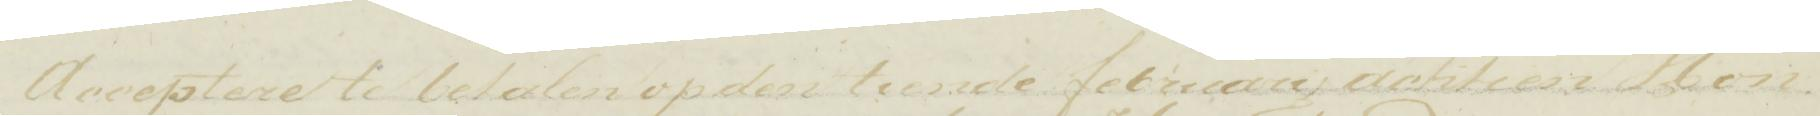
Acceptere te betalen op den tiende february achtien Hon
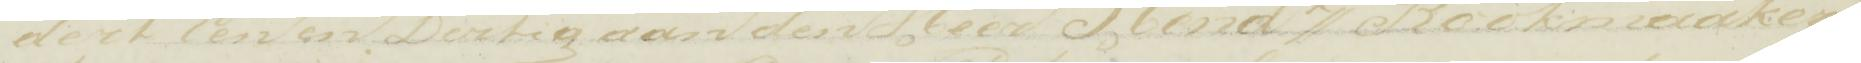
dert Een en Dertig aan den Heer Hend„k Rookmaaker
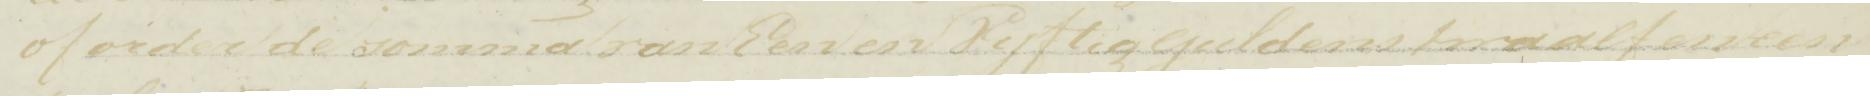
o/ order de somma van Een en Vyftig Guldens twaalf en een
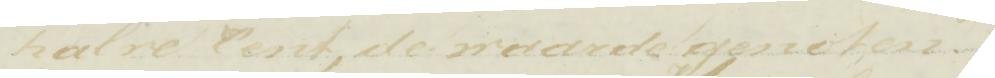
halve Cent, de waarde genoten.
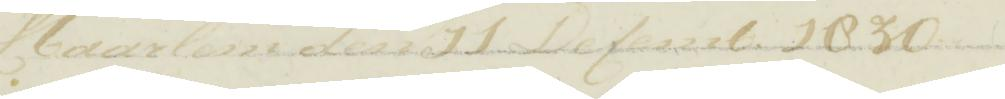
Haarlem den 11 Decemb. 1830
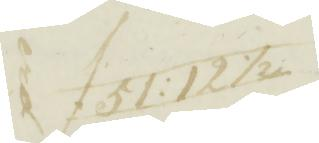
ƒ 51: 12½
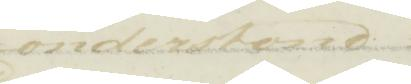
onderstond
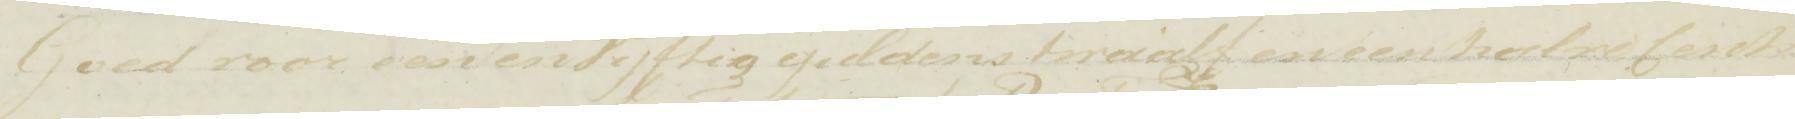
Goed voor een en vyftig guldens twaalf en een halve Cent
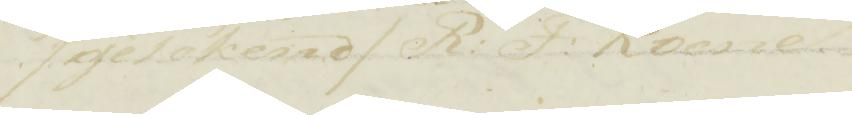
/ getekend / R:T: Koene
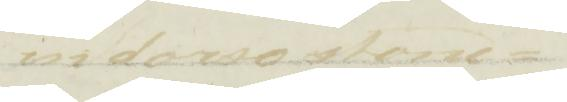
in dorso stond =
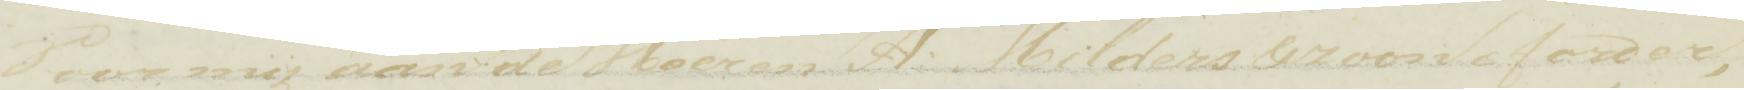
Voor mij aan de Heeren A: Milders & zoon o/ order,
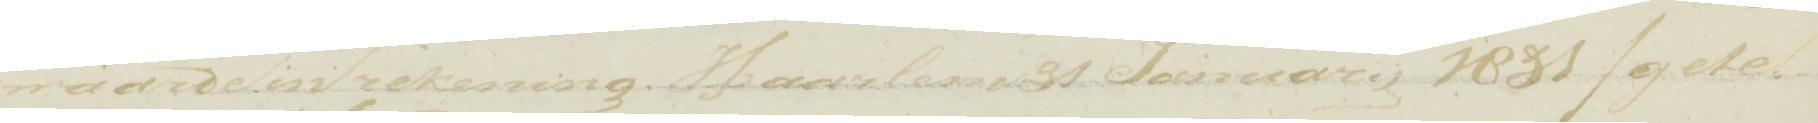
waarde in rekening Haarlem 31 Januarij 1831 / gete„
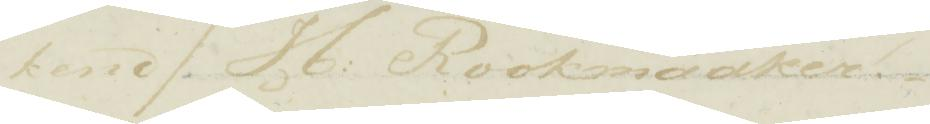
kend / H: Rookmaaker.
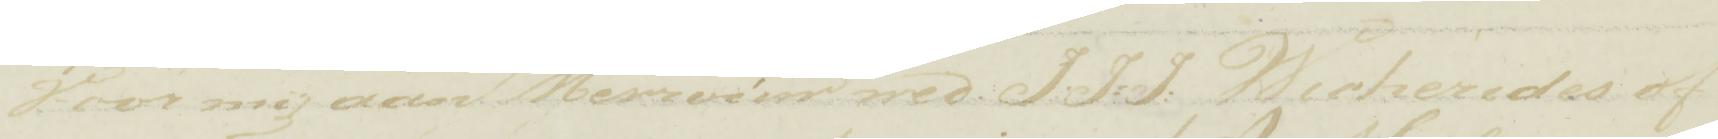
Voor mij aan Mevrouw wed. I: I: I: Nicherides of
